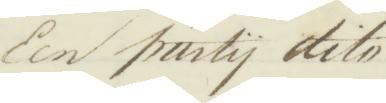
Een partij dito
